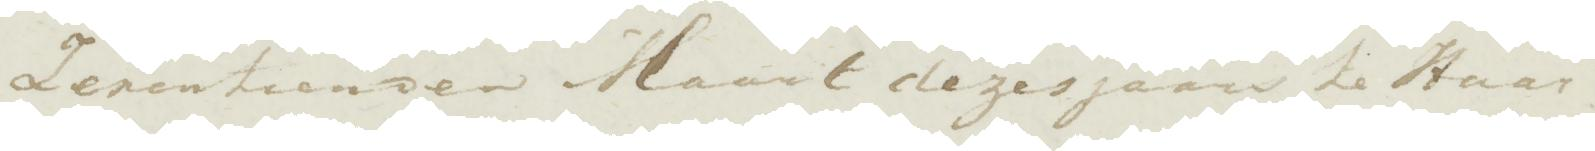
Zeventienden Maart dezes jaars te Haar
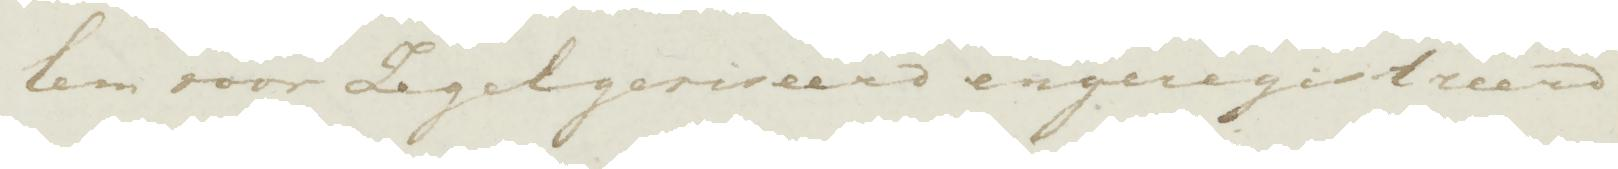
lem voor zegel geviseerd en geregistreerd
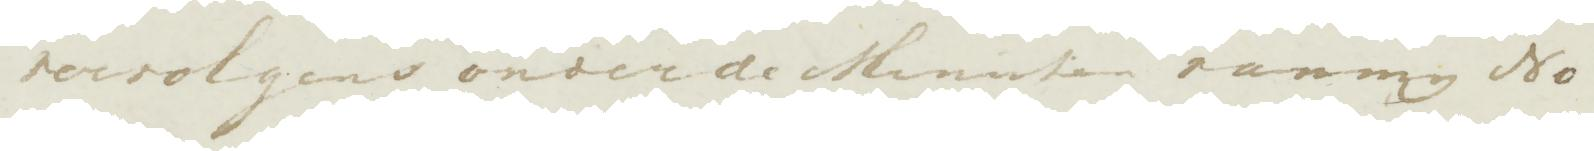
vervolgens onder de Minuten van my No
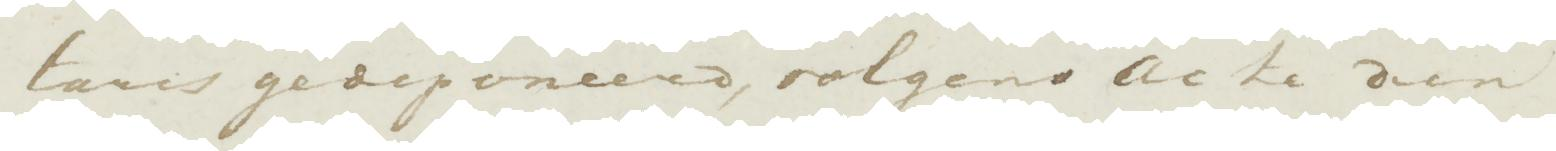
taris gedeponeerd, volgens Acte den
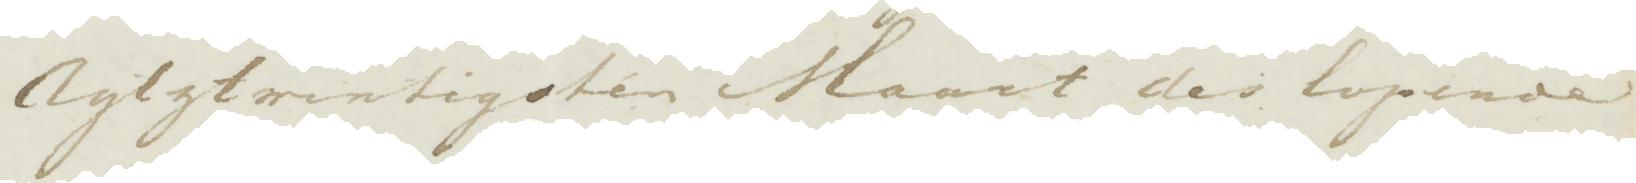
Agtentwintigsten Maart des lopende
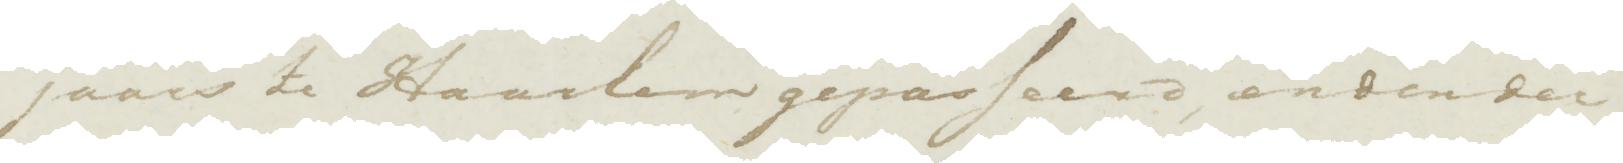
jaars te Haarlem gepasseerd, en den der
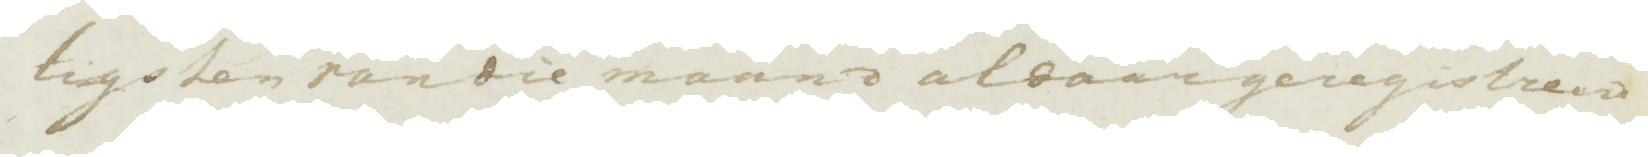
tigsten van die maand aldaar geregistreerd
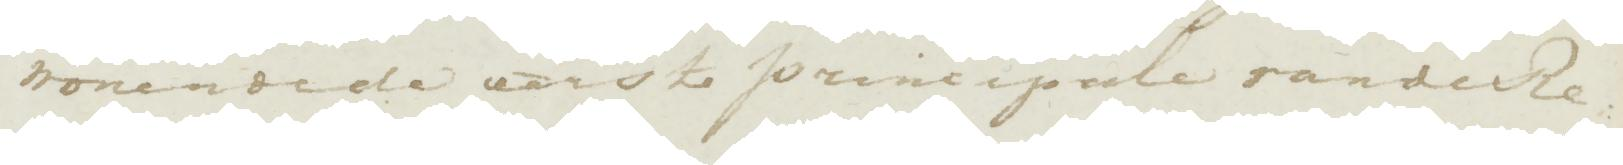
wonende de eerste principale van de Re
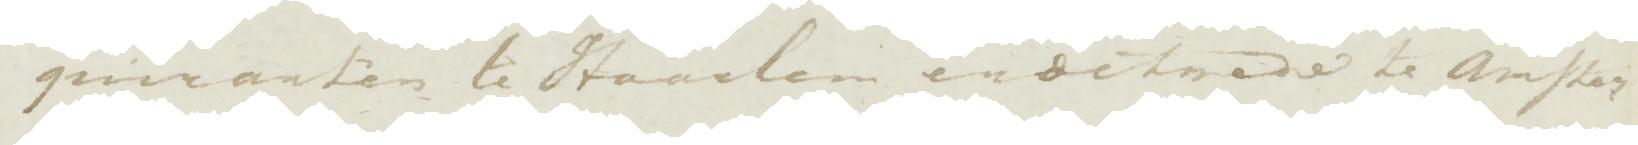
quiranten te Haarlem en dit mede te Amster
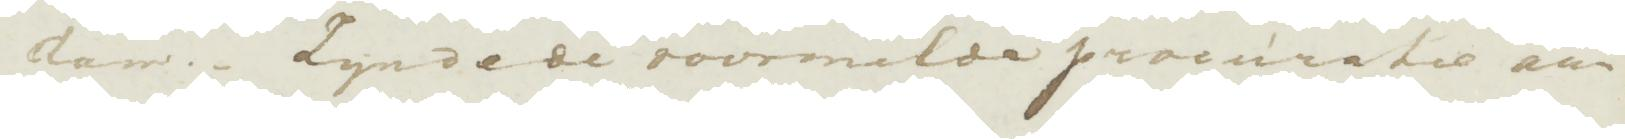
dam. - Zijnde de voormelde procuratie aan
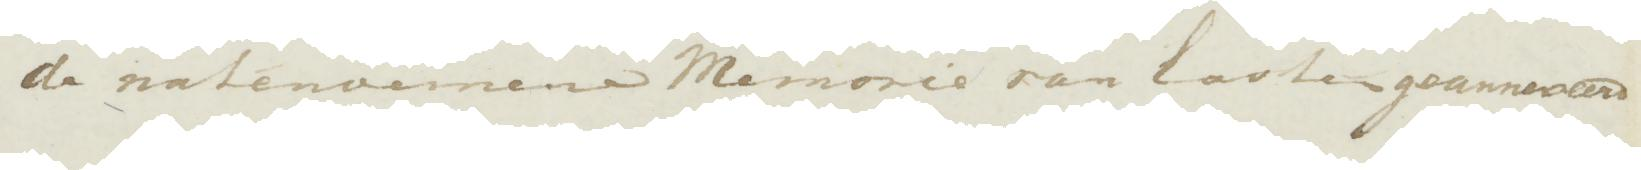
de natenoemene Memorie van lasten geannexeerd
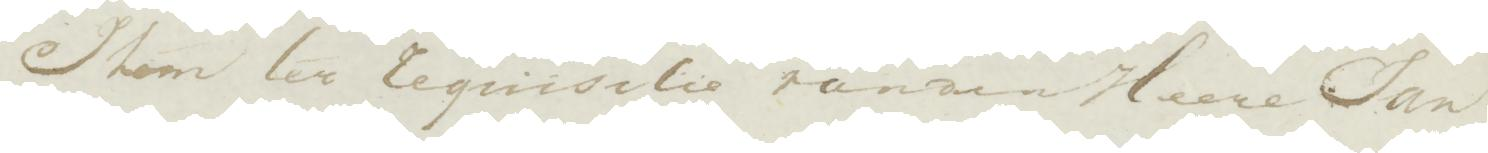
Jtem ter requisitie van den Heere Jan
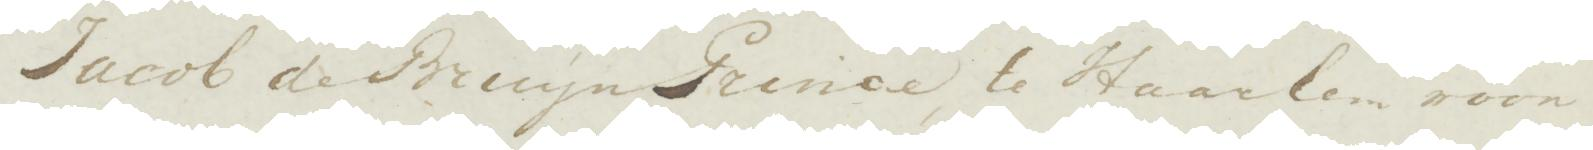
Jacob de Bruijn Prince, te Haarlem woon
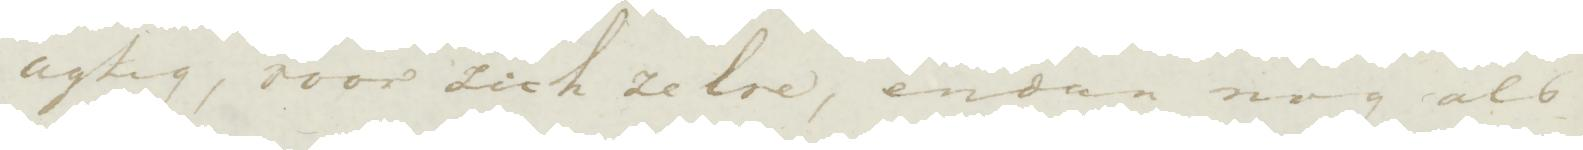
agtig, voor zich zelve, en dan nog als
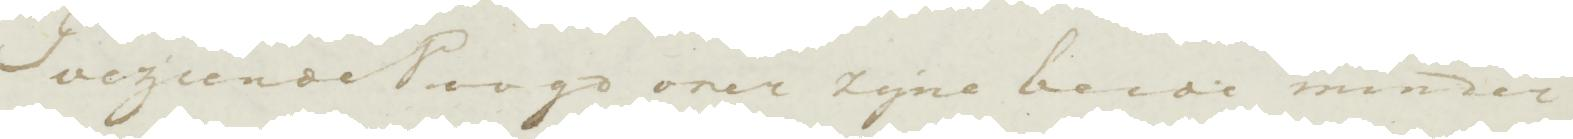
Toeziende Voogd over zijne beide minder
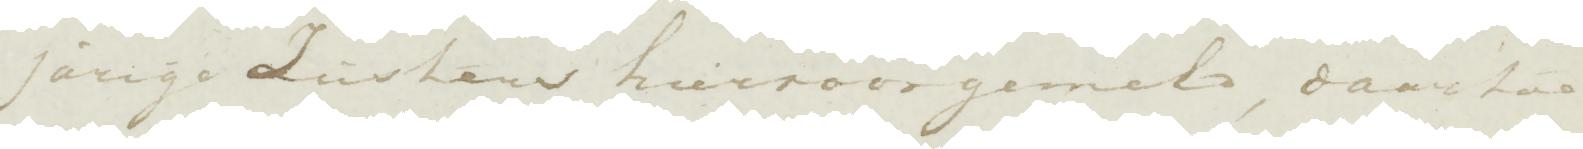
jarige Zusters hiervoor gemeld, daar toe
